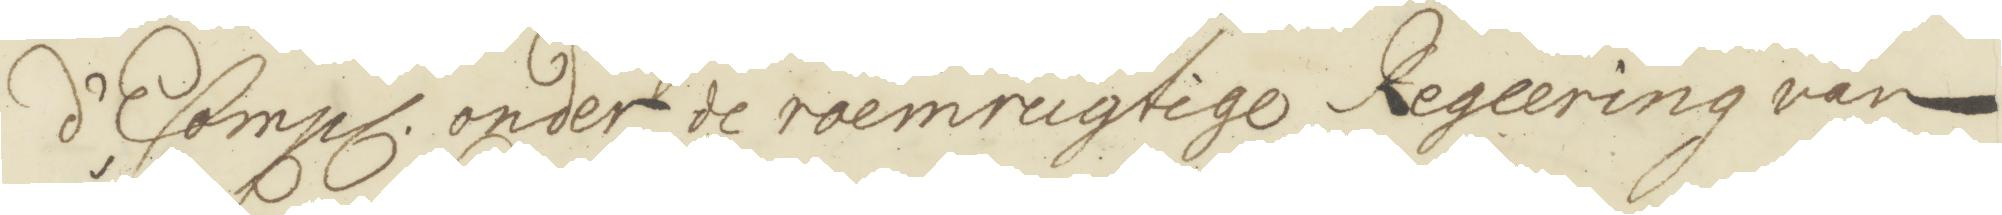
d' EComp: onder de roemrugtige Regeering van
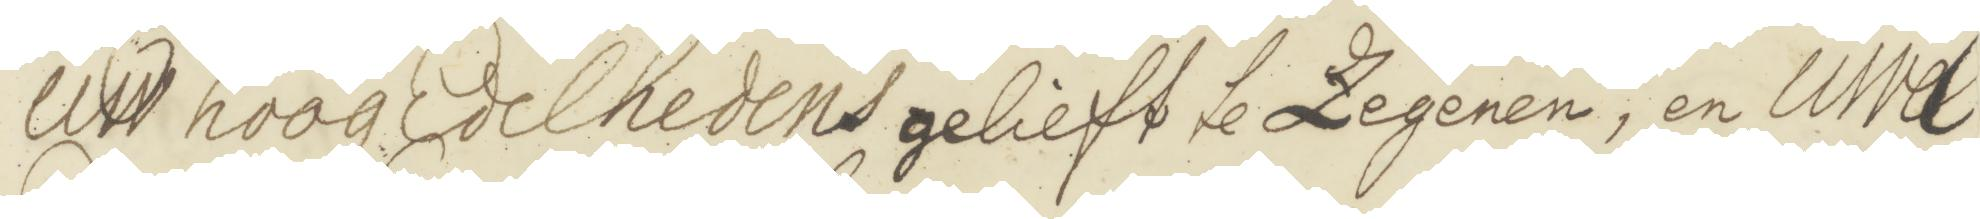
uw hoog Edelhedens gelieft te Zegenen, en UWel
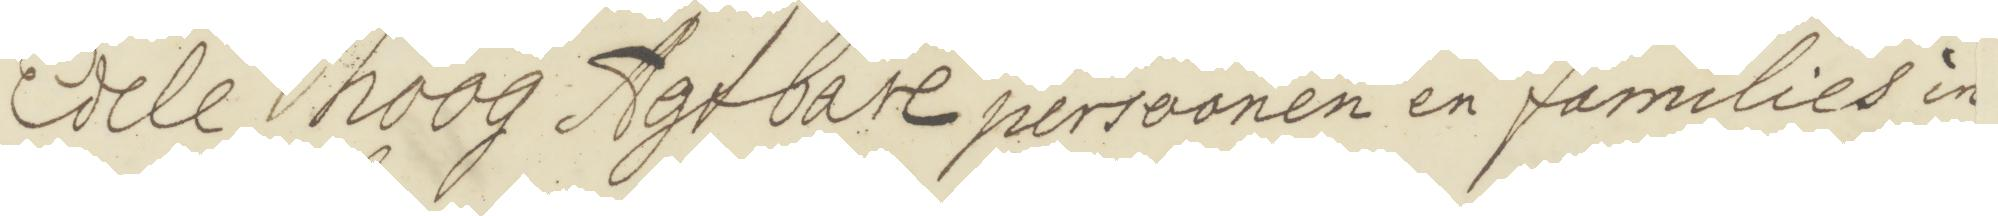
Edele hoog Agtbare persoonen en families in
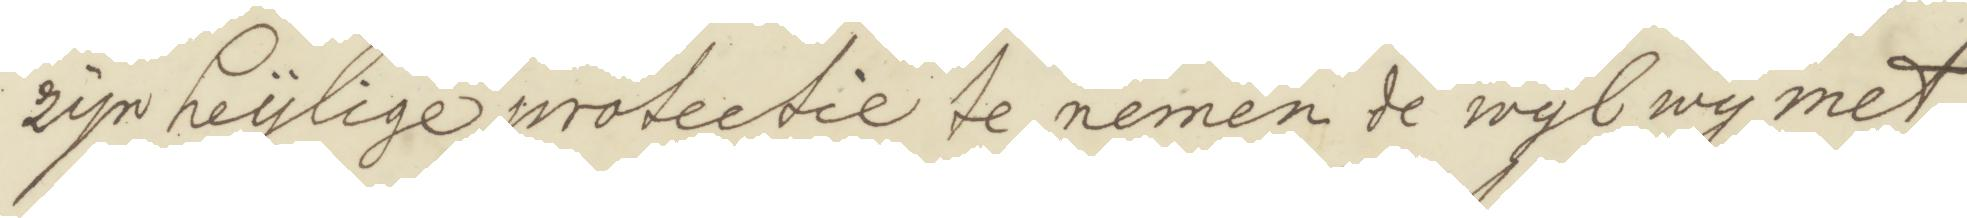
zijn heijlige protectie te nemen de wijl wij met
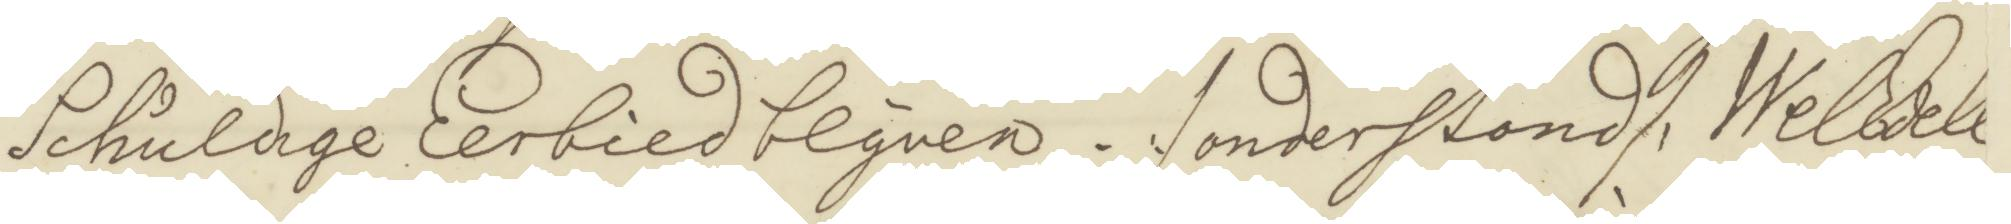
Schuldige Eerbied blijven - /onderstond/ WelEdele
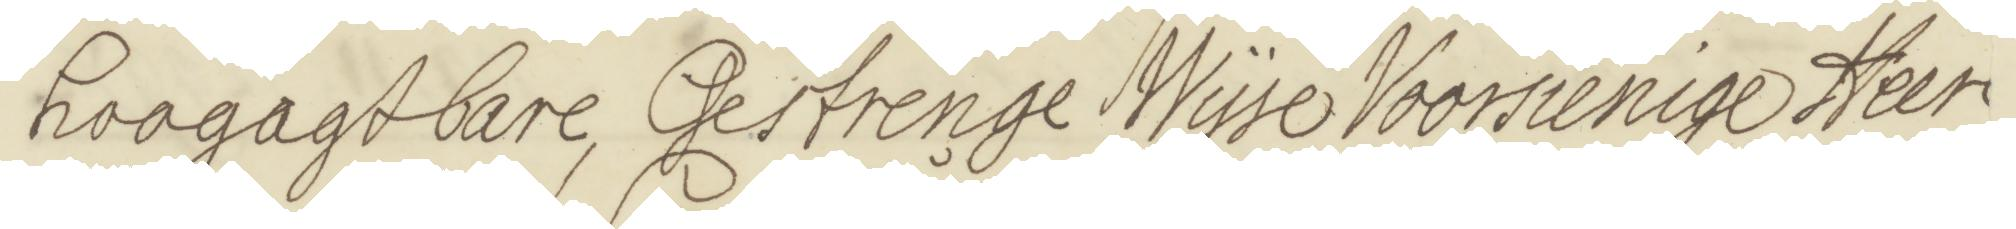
hoogagtbare Gestrenge Wijse Voorsienige Heer
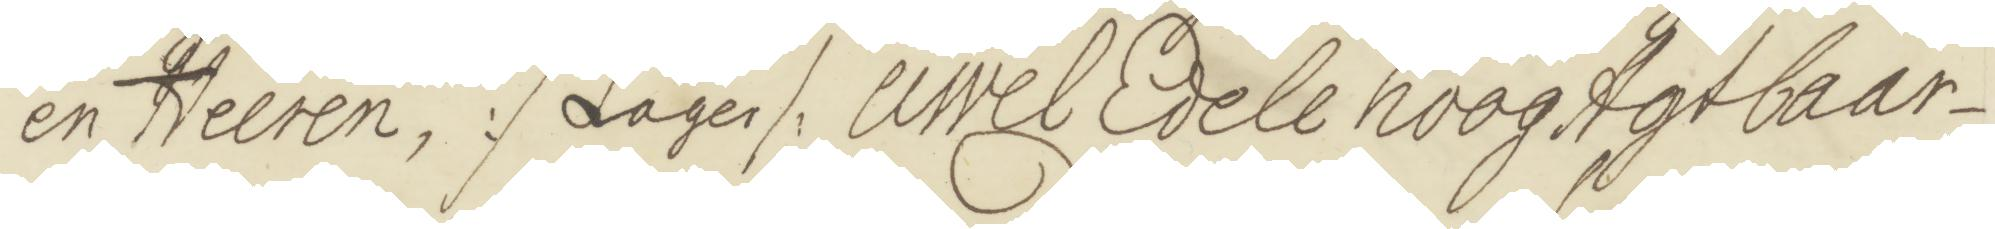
en Heeren, /Lager/ UWel Edele hoog Agtbaar —
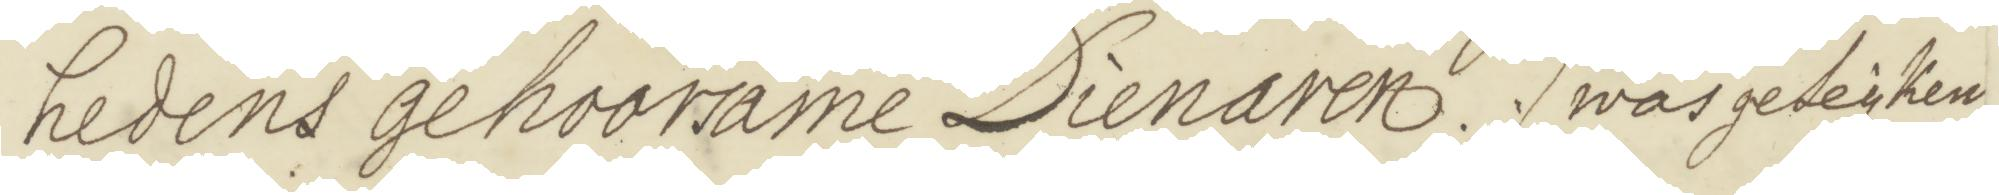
hedens gehoorsame Dienaren. /was geteijken
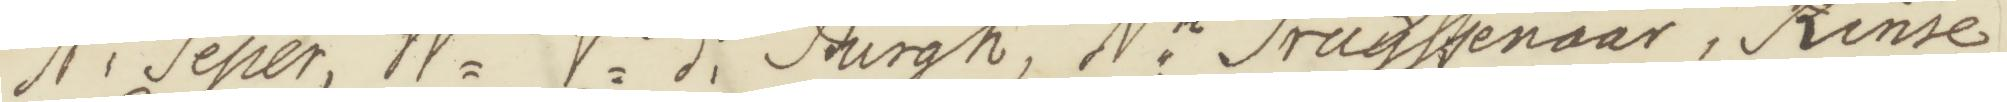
A„t Peper, W=m V=n d„r Burgh, H„k Pruijssenaar, Rinse
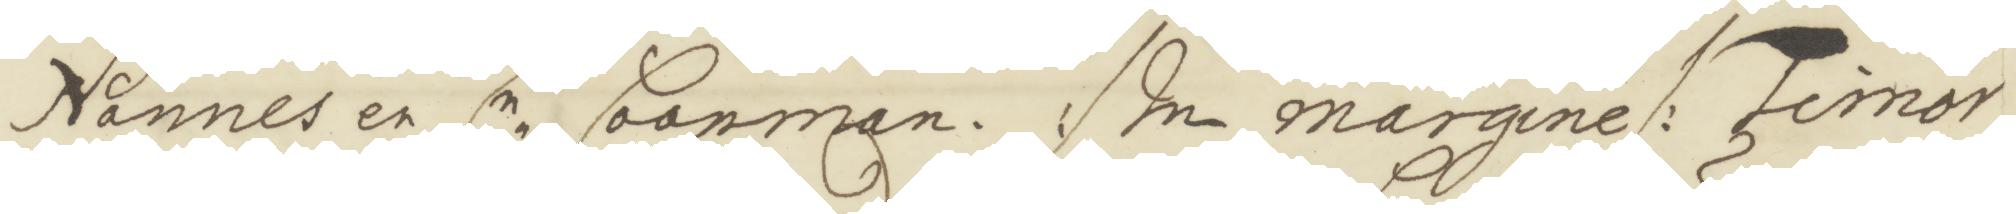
Nannes en C„n Coopman. :/In margine/: Timor
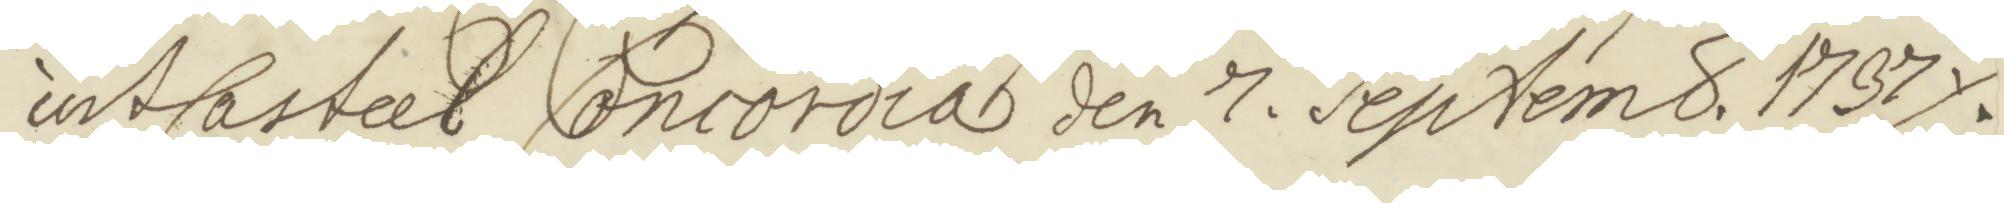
in't Casteel Concordia den 7. Septemb: 1737
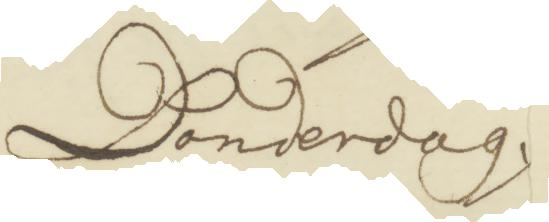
Donderdag,
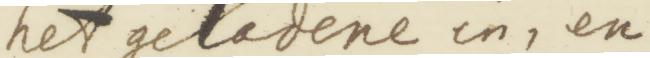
het geladene in, en
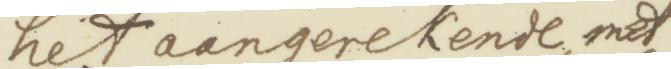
het aangerekendl met
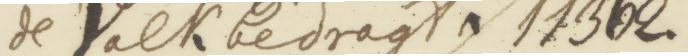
de Valk bedragt ƒ 11362.
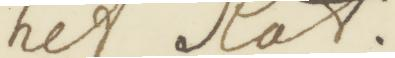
het slat.
